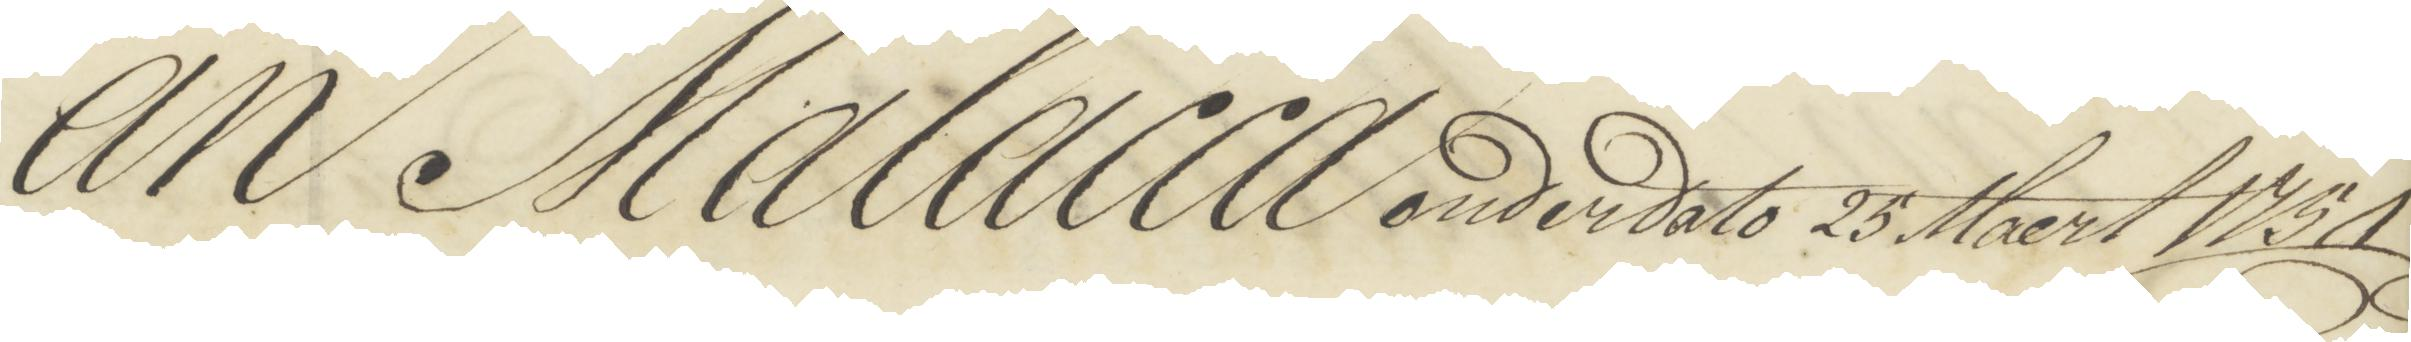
Van Malacca onder dato 20 Maert 1754
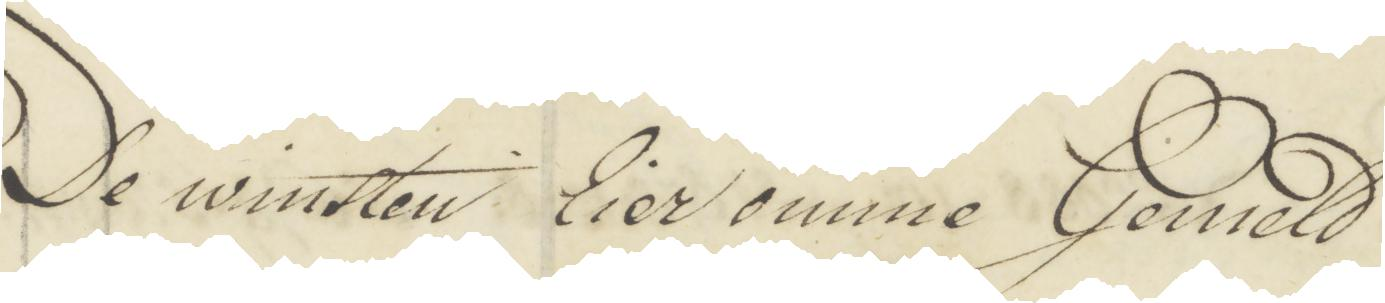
De winsten hier omme Gemeld bedragen . . . ƒ11022:
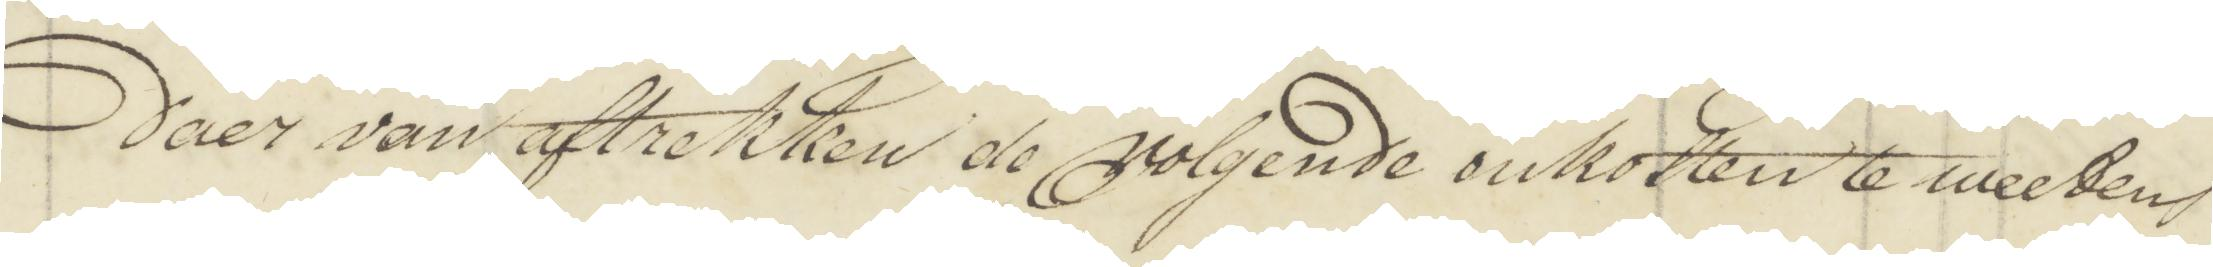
daer van aftrekken de volgende onkosten te weeten,
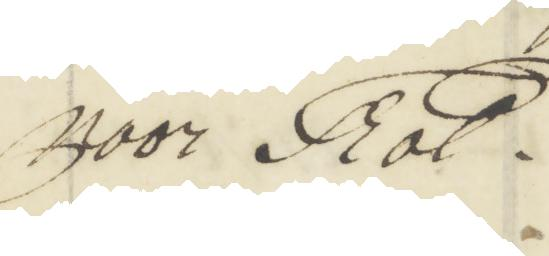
voor Thol . . . ond: gew: th: 5: 5:
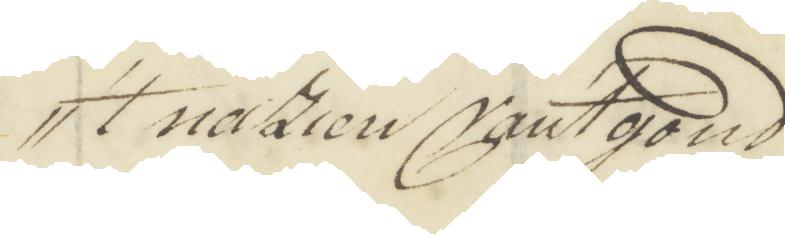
„’t nazien van't goud „ „ „ 4: 1:
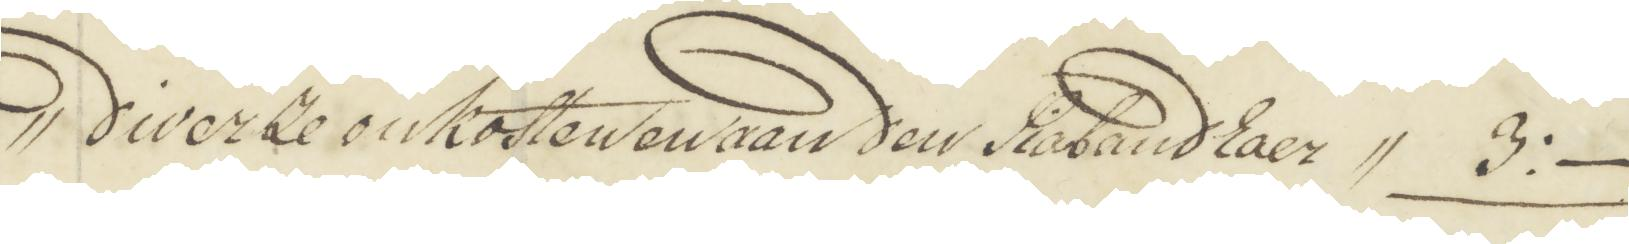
„ diverze onkosten waar den Siabandhaer „ 3: —
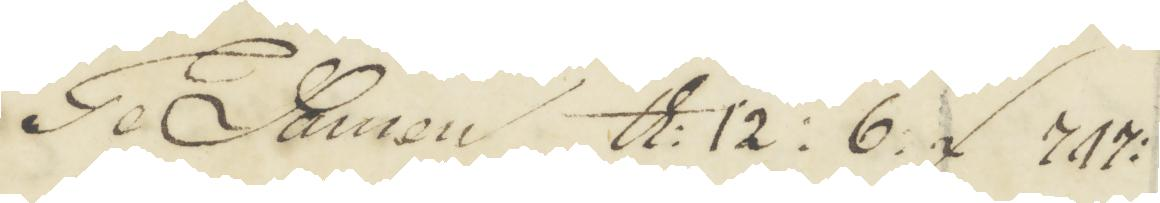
Te Samen th: 12: 6: ƒ 747: 5:—
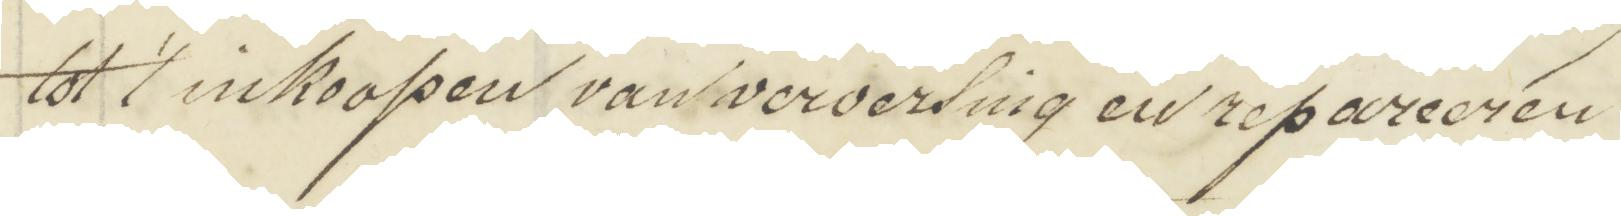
tot 't inkoopen van verversing en repareeren
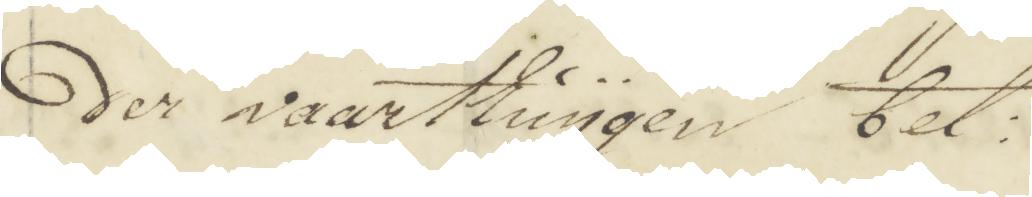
der vaarthuijgen bel: . . . . . . „. 204: — —
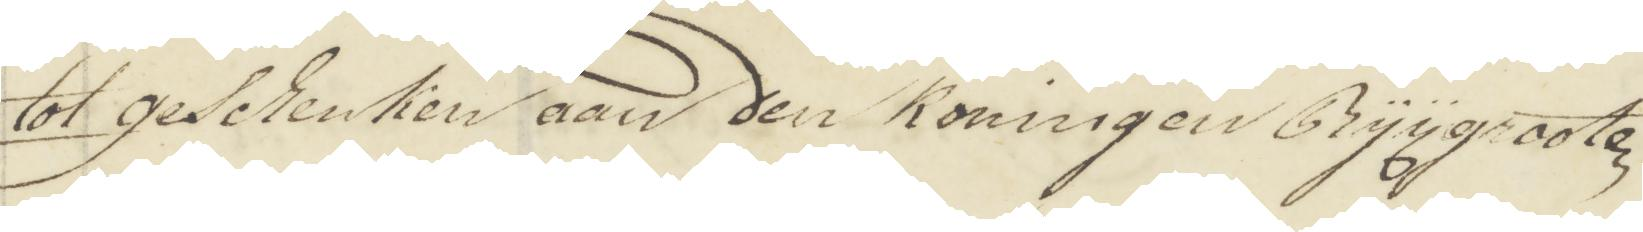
tot geschenken aan den koningen Rijxgrooten
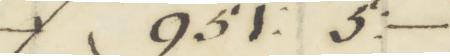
ƒ 951: 5:—
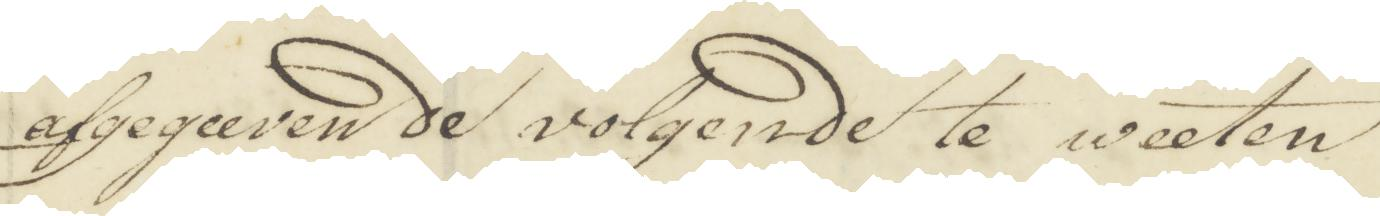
afgegeeven de volgende te weeten
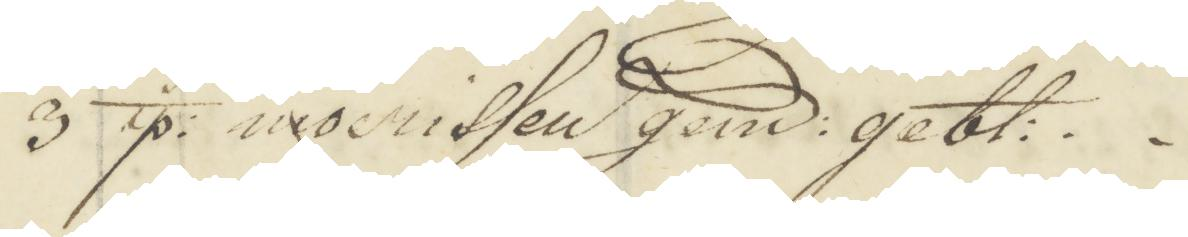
3 p:s morrissen gem: gebl: . . . . . . „ 13: 19:—
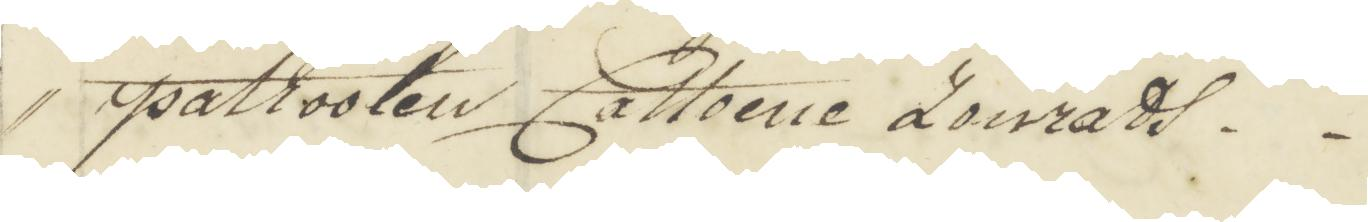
6 „ pathoolen Cattoene zourats . . . . . „ 14: 11: 8
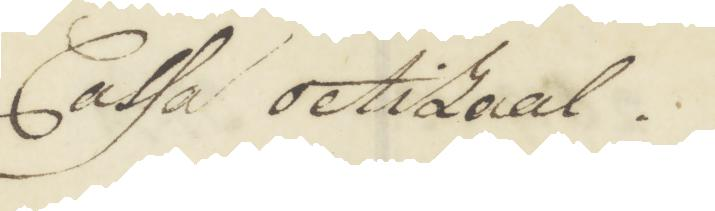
7 „ Cassa oetizaal . . . . . . . . „ 31: 12: 8
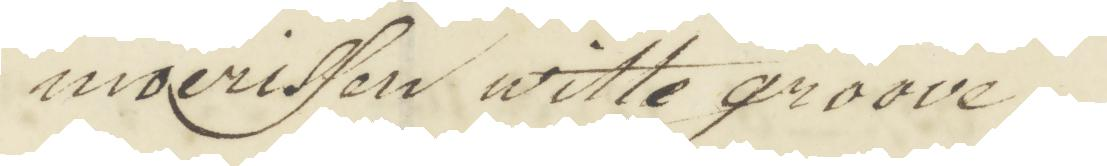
2 „ moerissen witte groove . . . . „ 8: 3:—
